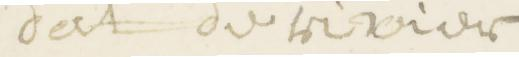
dat de rivier
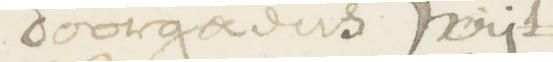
doorgaens wijt en
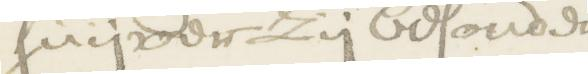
suijver zij besonder
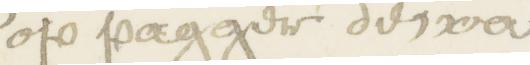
op pagger dewa
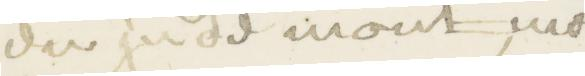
en jnde mont, met
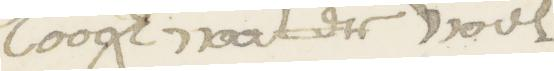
hoogh water wel
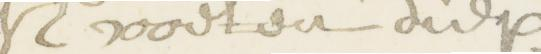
12 voeten diep
